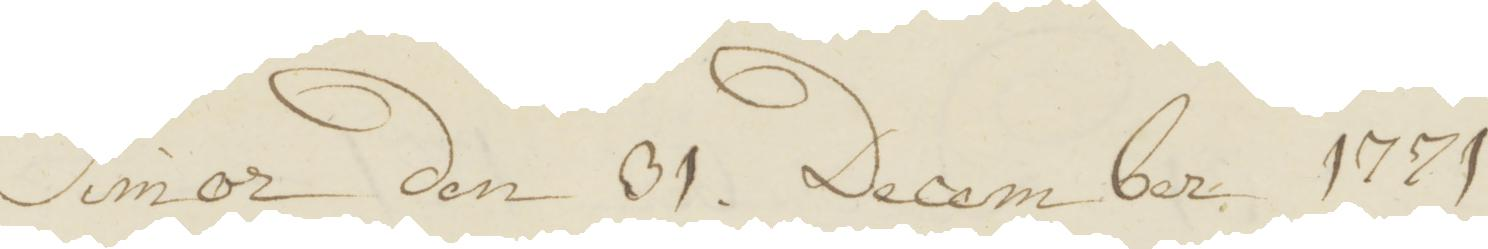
Timor den 31. December 1771
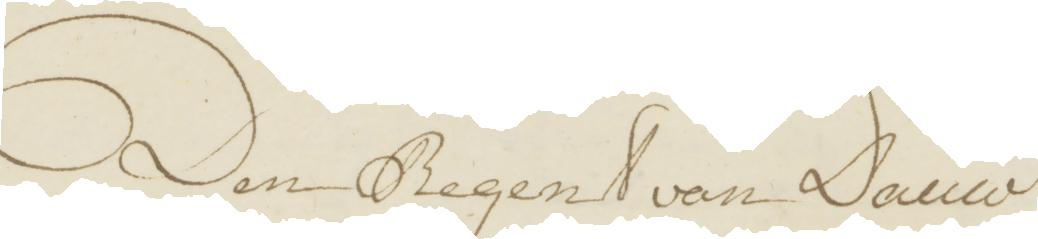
Den Regent van Dauw
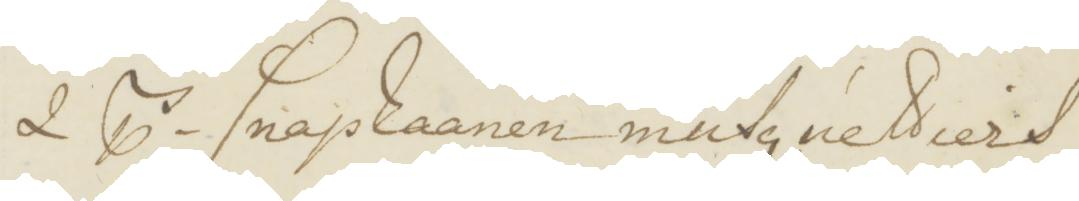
2 p.en snaphaanen musquetiers
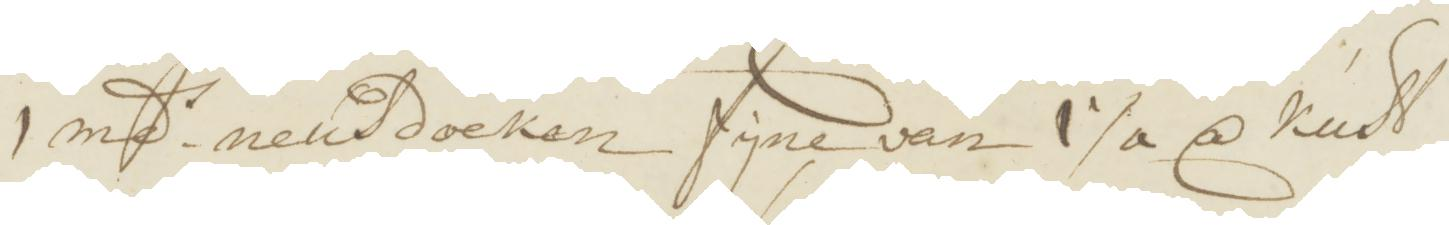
1 md. neusdoeken fijne van 1¼ @ kuss
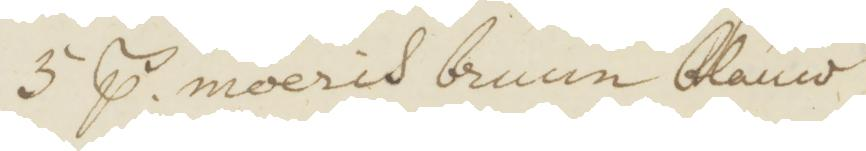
5 p.en moeris bruun blauw
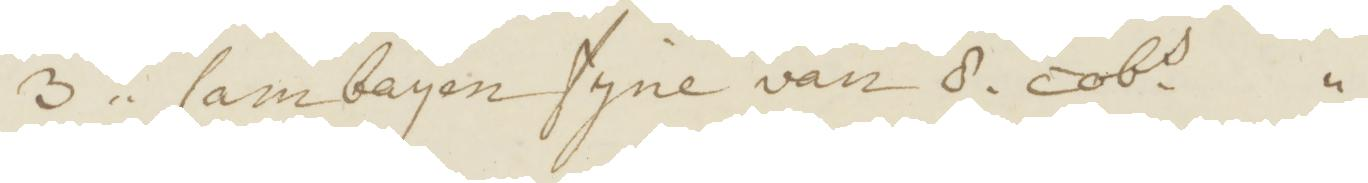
3 „ Cambaijen fijne van 8. cob.s „
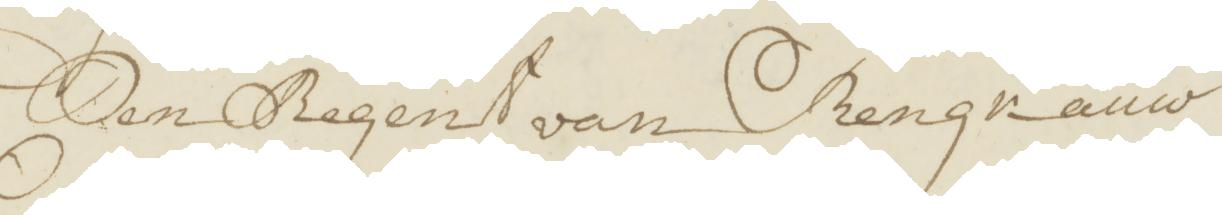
Den Regent van Bengvauw
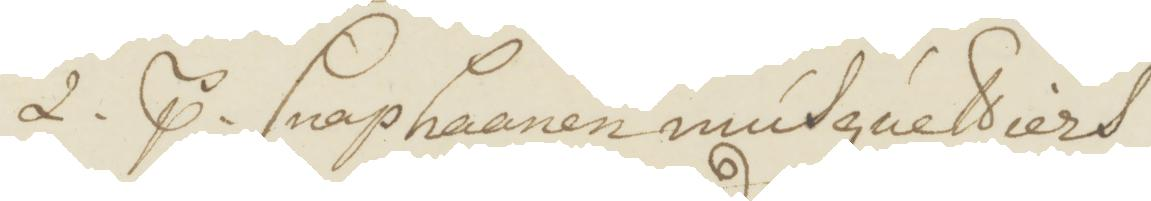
2. p.en Snaphaanen musquetiers
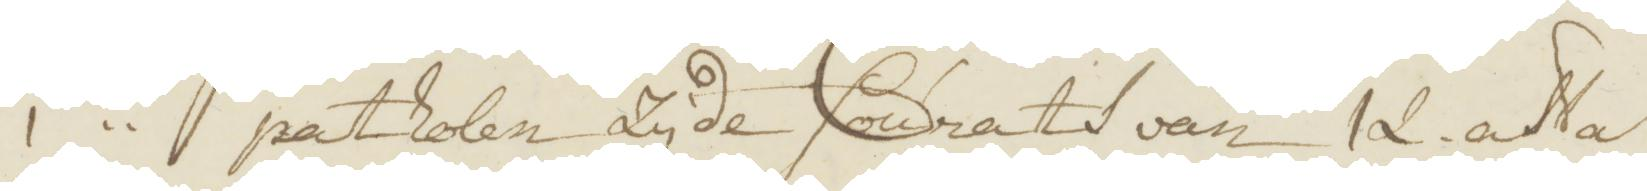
1 „ patholen zyde sourats van 12. assa
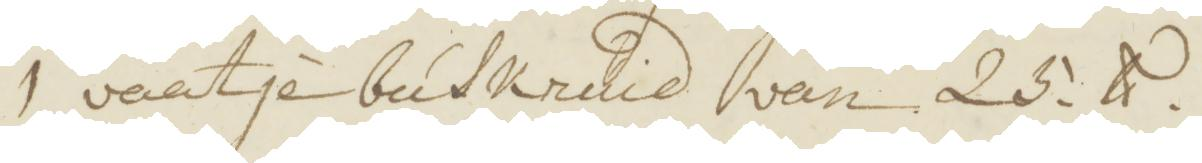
1 vaatje buskruid van 25. lb.
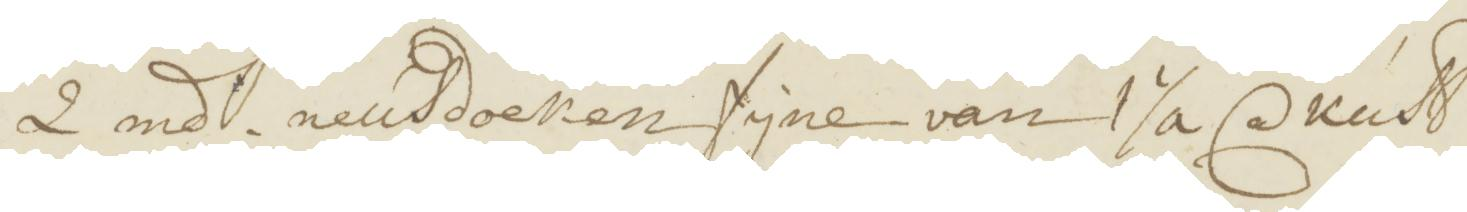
2 md. neusdoeken fijne van 1¼ @ kuss
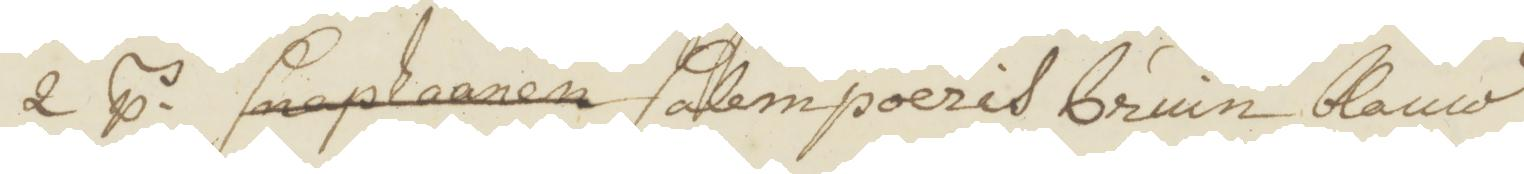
2 p.en snaphaanen Salempoeris bruin blauw
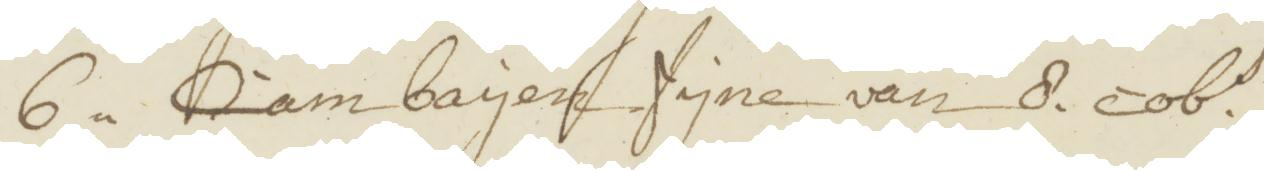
6 „ Dambaijen fijne van 8. cob.s
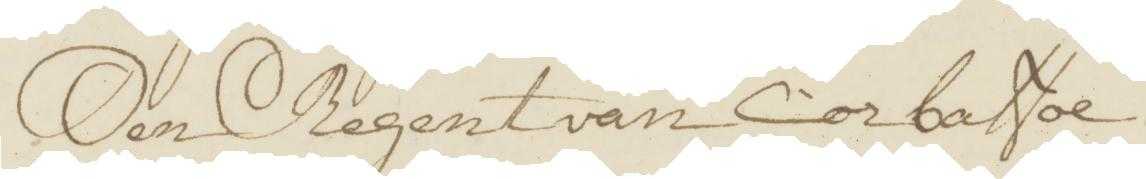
Der Regent van Corbassoe
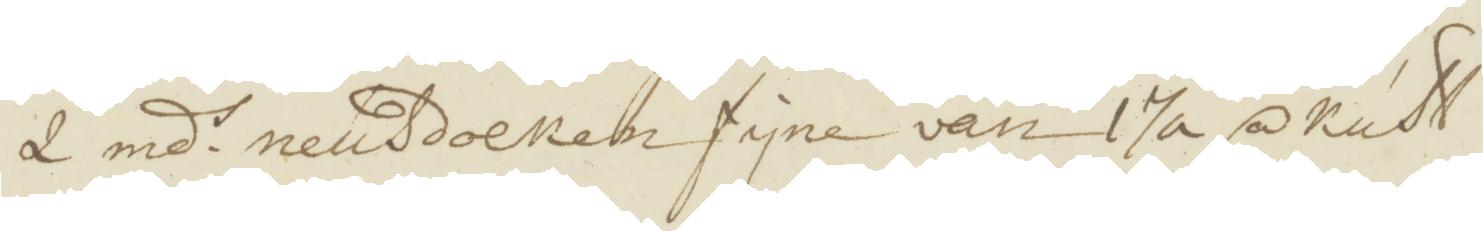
2 md.en neusdoeken fijne van 1¼ @ kuss
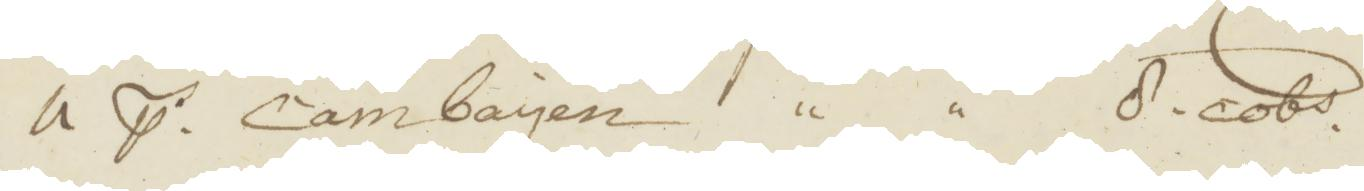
4 p.en Cambaijen „ „ 8 cobs.
